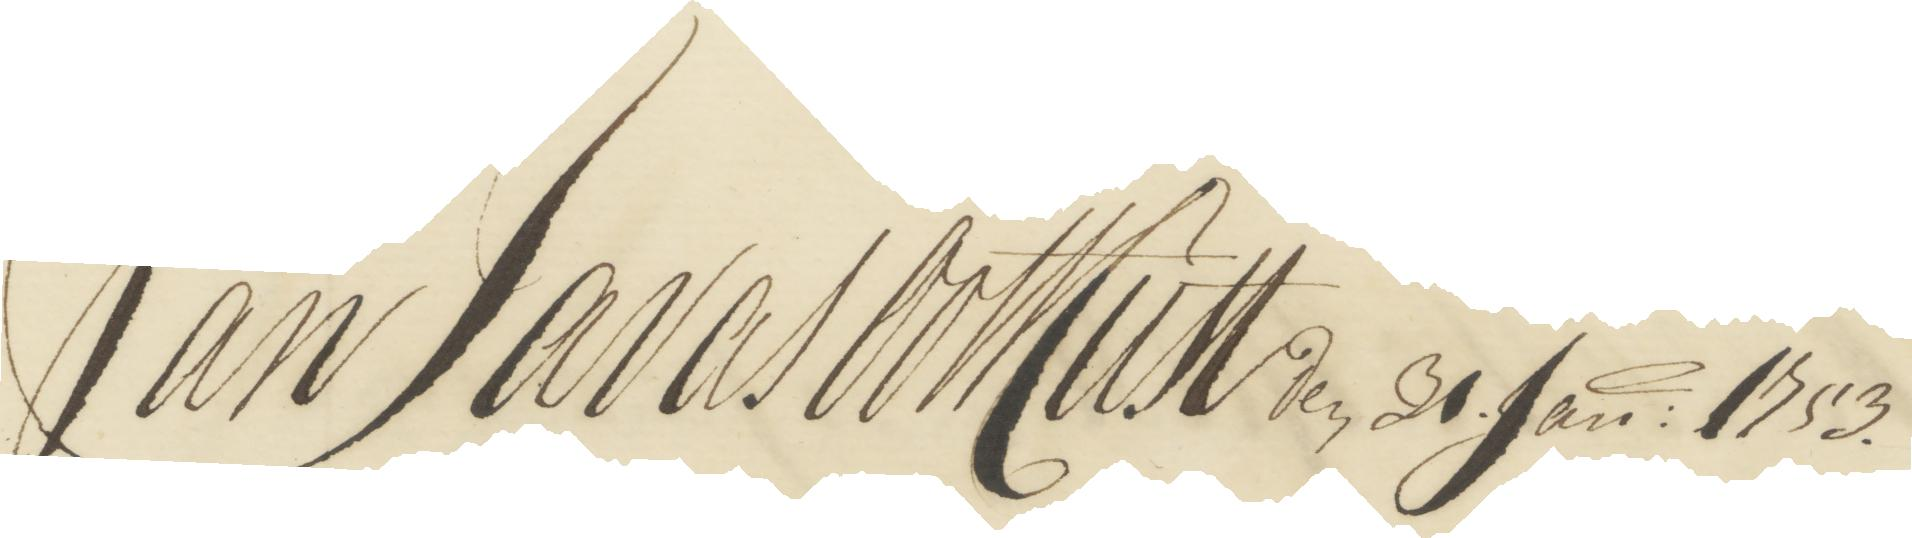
Van Javas Oost Cust den 31. Jan: 1753.
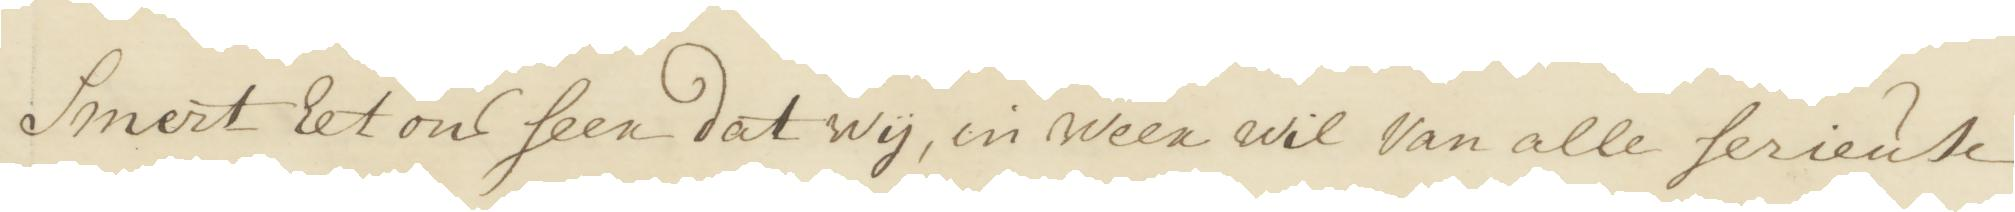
Smert het ons seer dat wij, in weer wil van alle serieuse
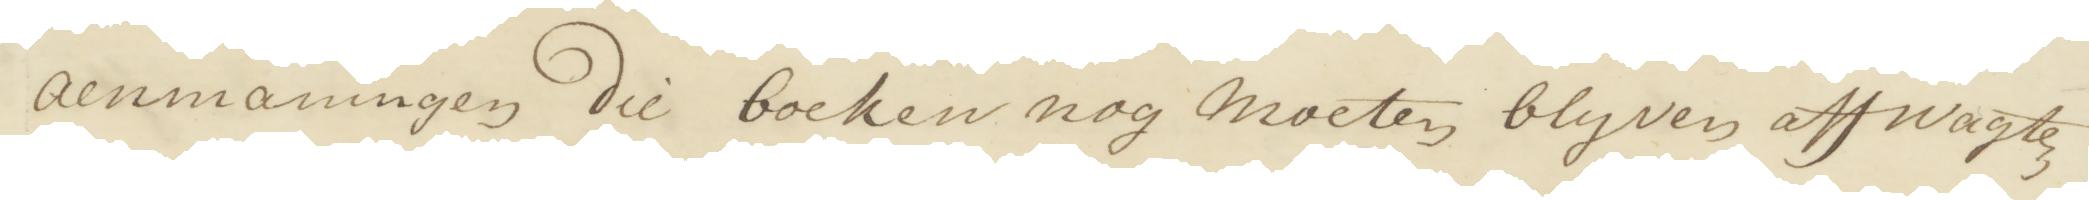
aenmaningen die boeken nog moeten blyven affwagten
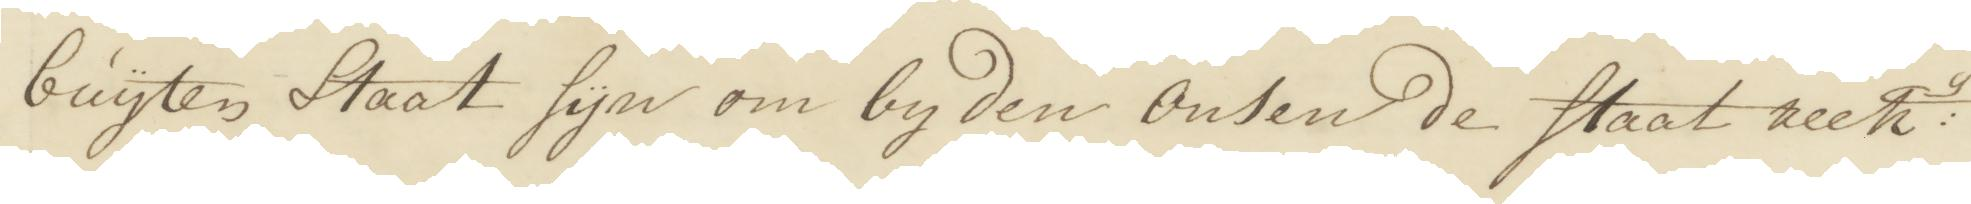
buijten staat sijn om by den onsen de staat reek:g
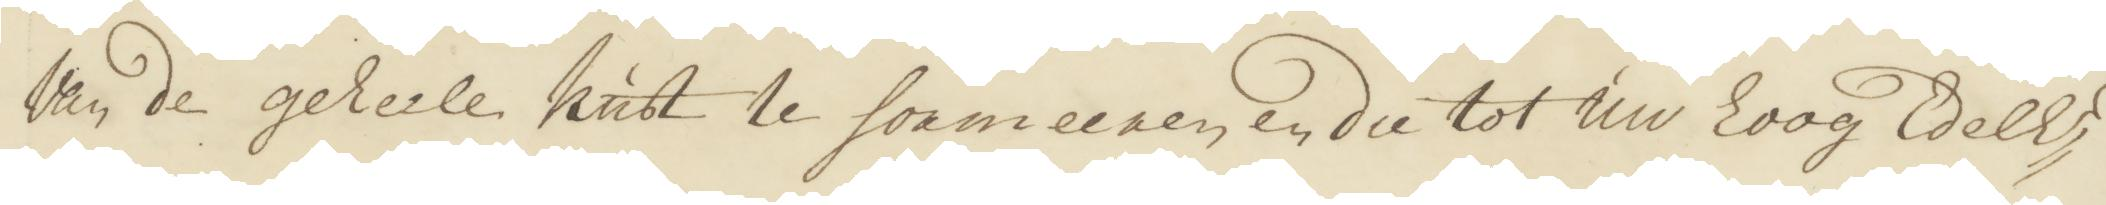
van de geheele kust te sormeeren en die tot uw hoog Edelh„s
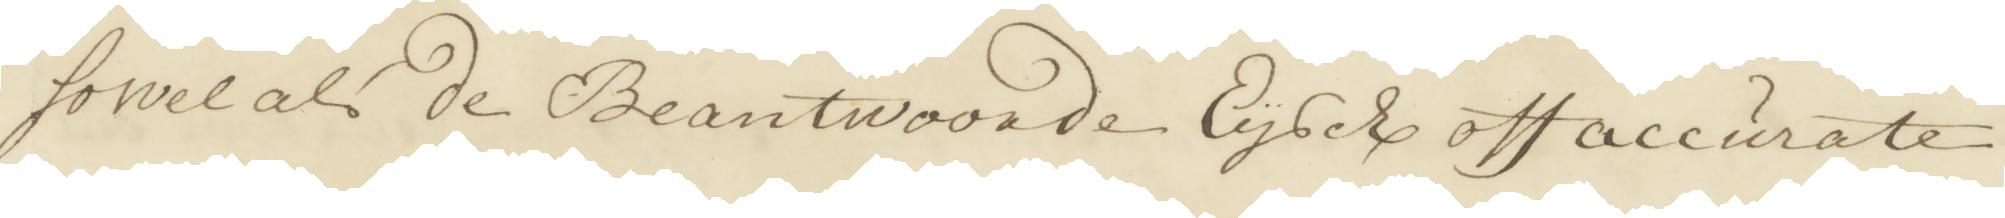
sowel als de Beantwoorde Eijsch off accurate
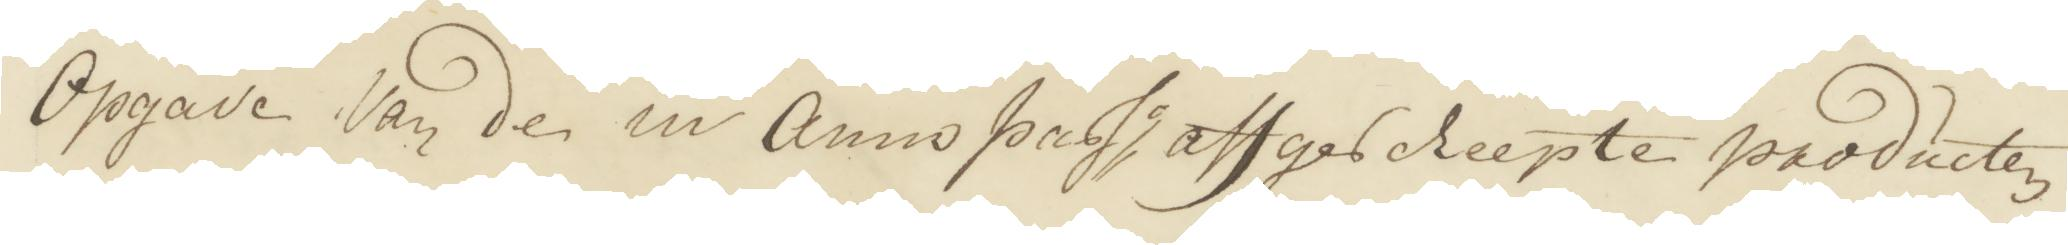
Opgave van de in Anno pass„o affgescheepte producten
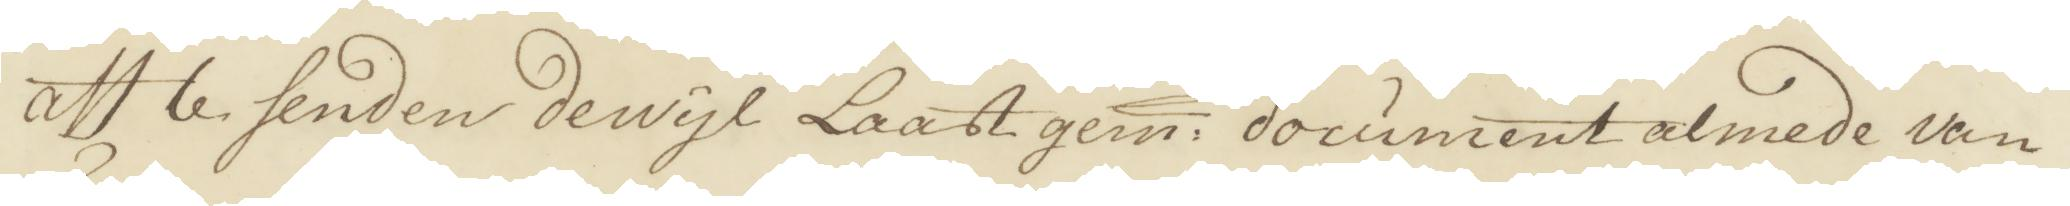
aff te senden dewijl Laast gem: document almede van
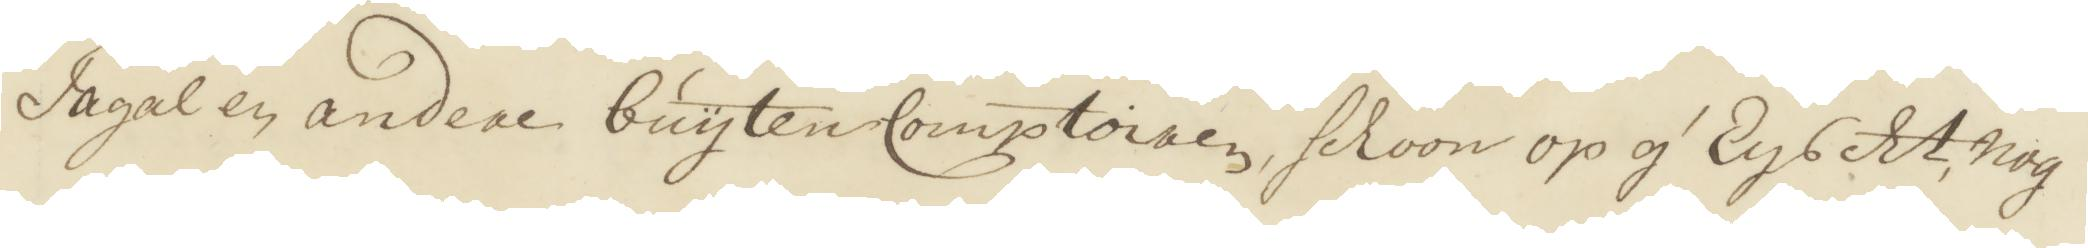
Tagal en andere buijten Comptoiren, schoon op g'Eyscht, nog
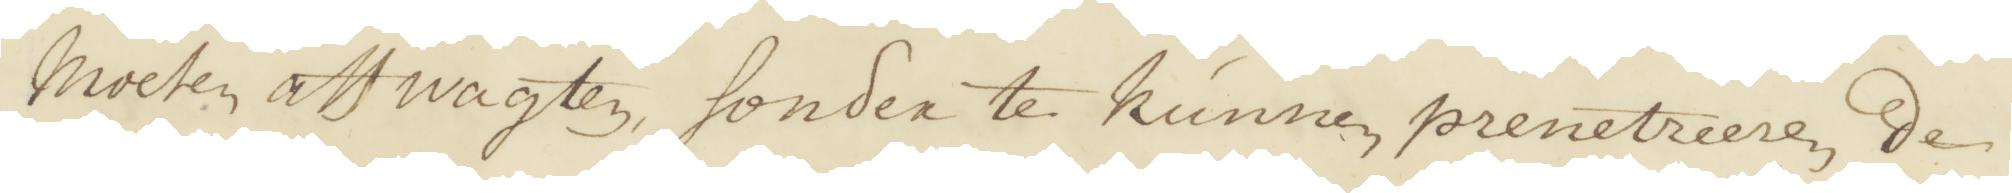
moeten affwagten, sonder te kunnen prenetreeren de
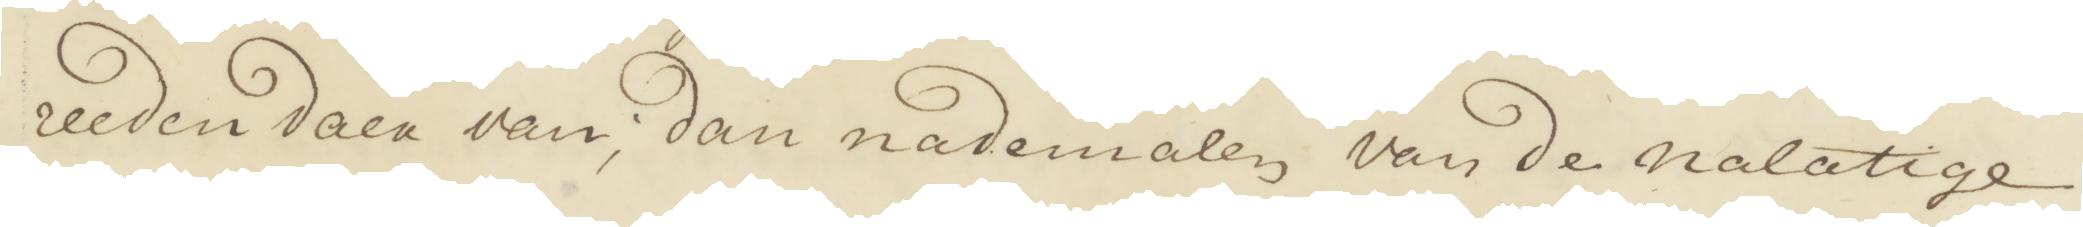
reeden daer van; dan nademalen van de nalatige
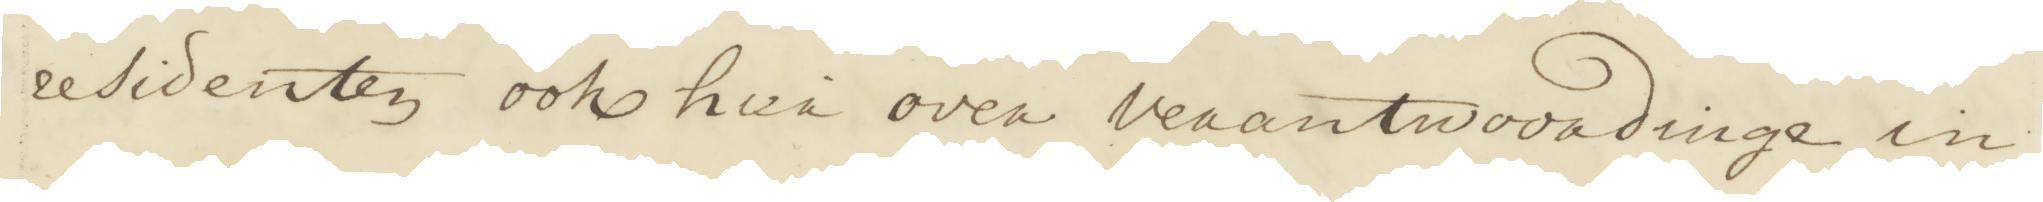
residenten ook hier over verantwoordinge in
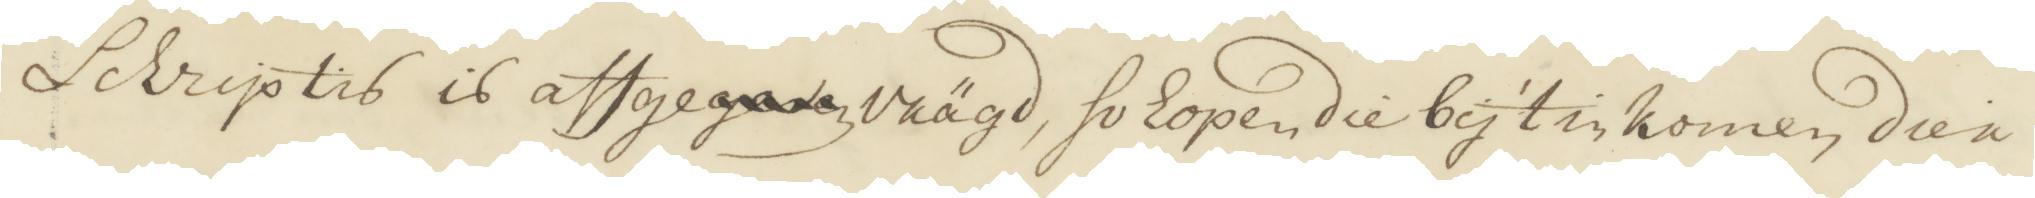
schriptis is affgegevenvrägd, so hopen die bij't in komen dier
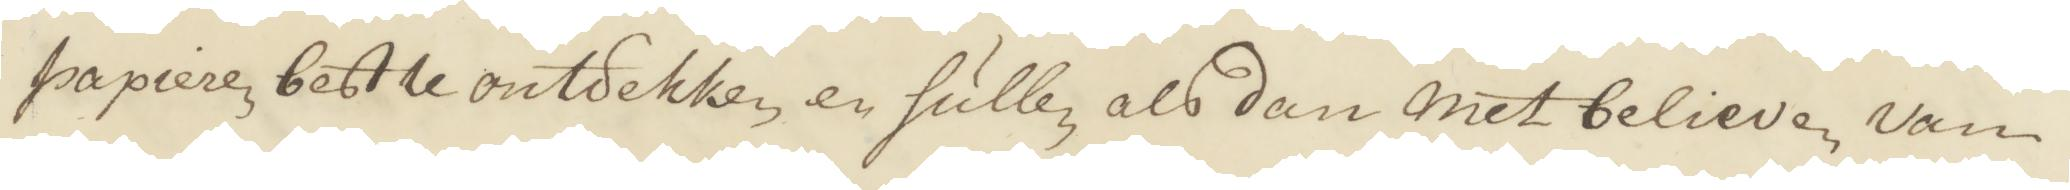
papieren best te ontdekken en sullen als dan met believen van
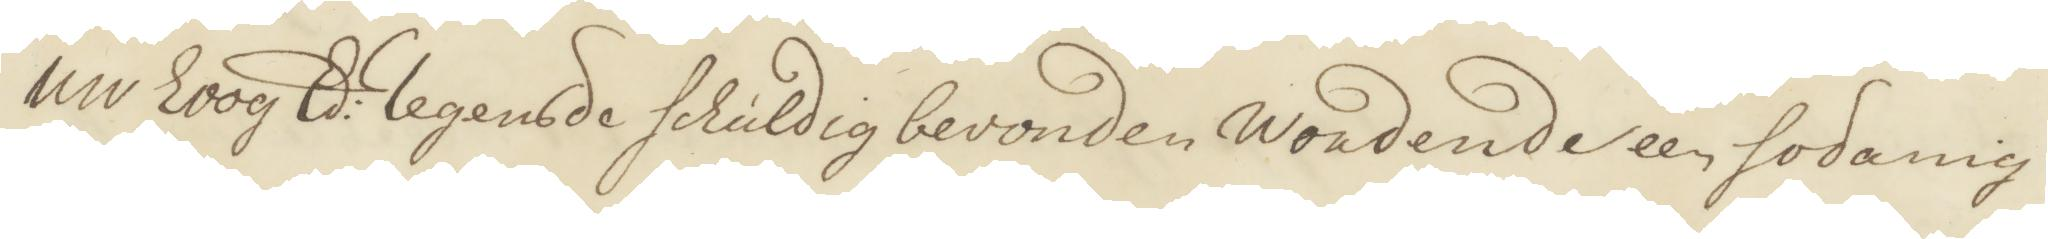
uw hoog Ed:s tegensde schuldig bevonden wordende een sodanig
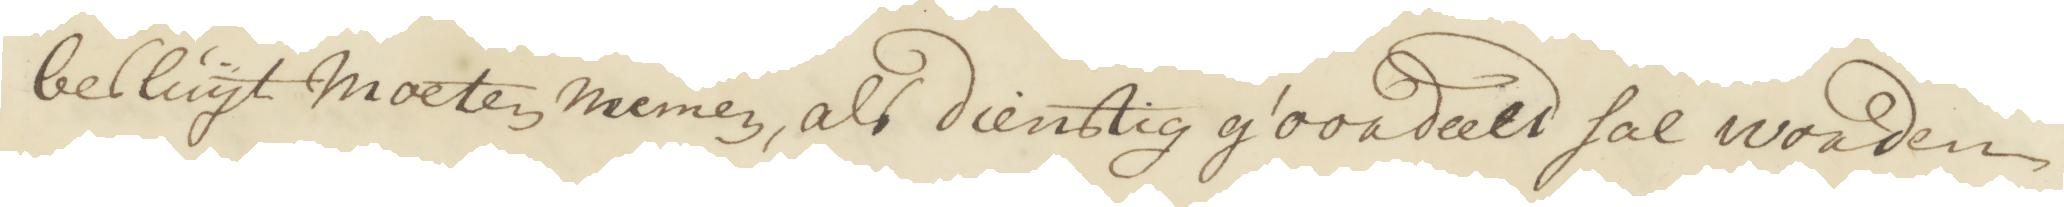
besluijt moeten memen, als dienstig g’oordeeld sal worden
